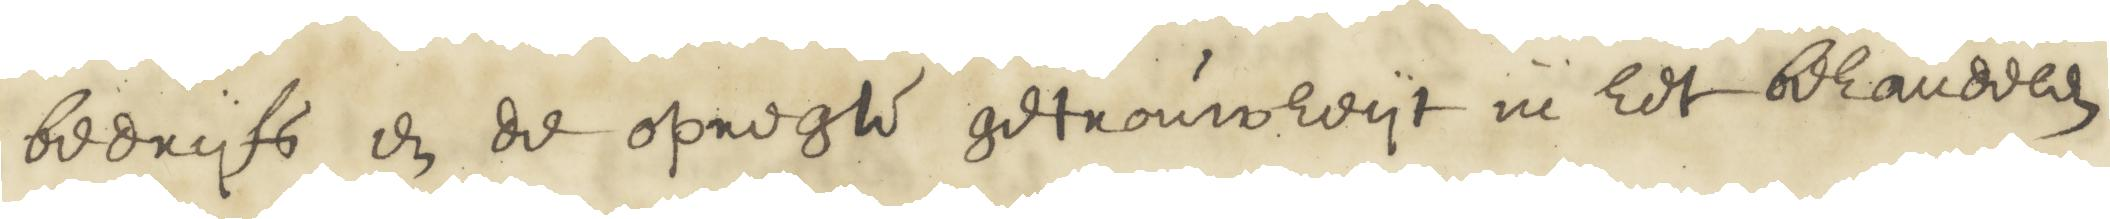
bedrijfs en de opregte getrouwheijt in het behandelen
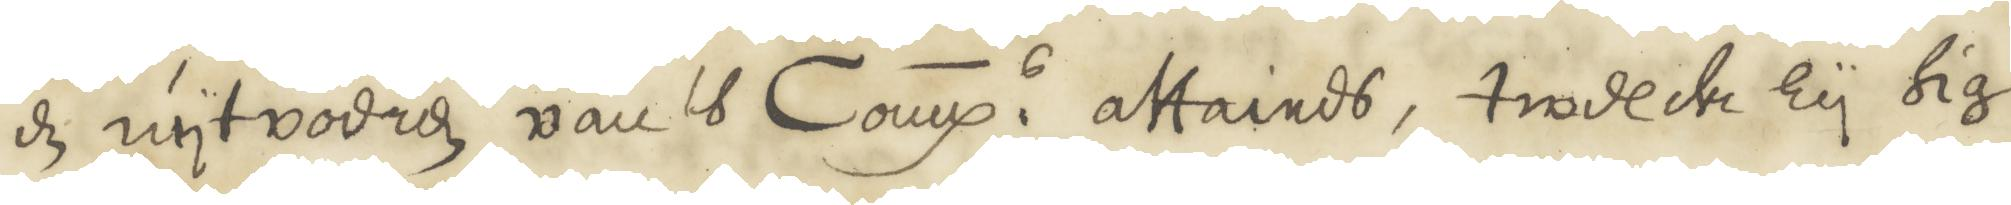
en uijtvoeren van ’s Comp:s affaires, twelck hij sig
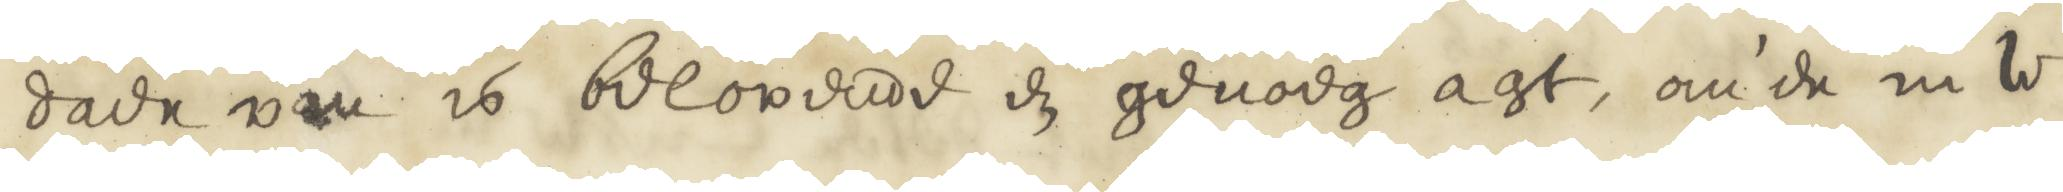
daer van is belovende en genoeg agt, om 'er in te
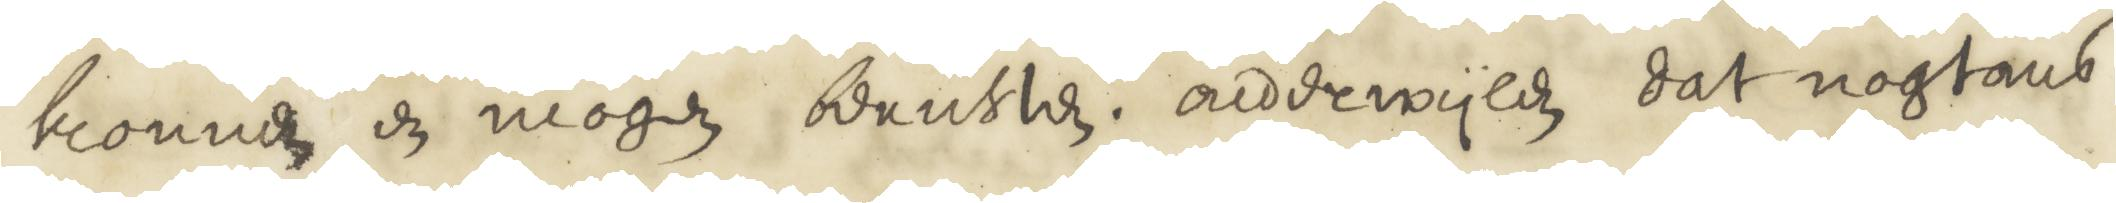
konnen en mogen berusten, onderwijlen dat nogtans
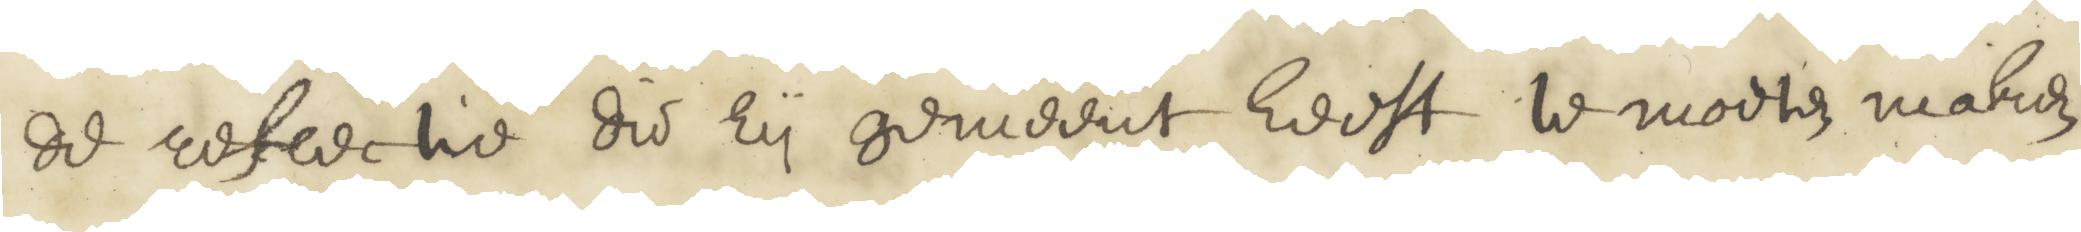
de reflectie die hij gemeent heeft te moeten maken
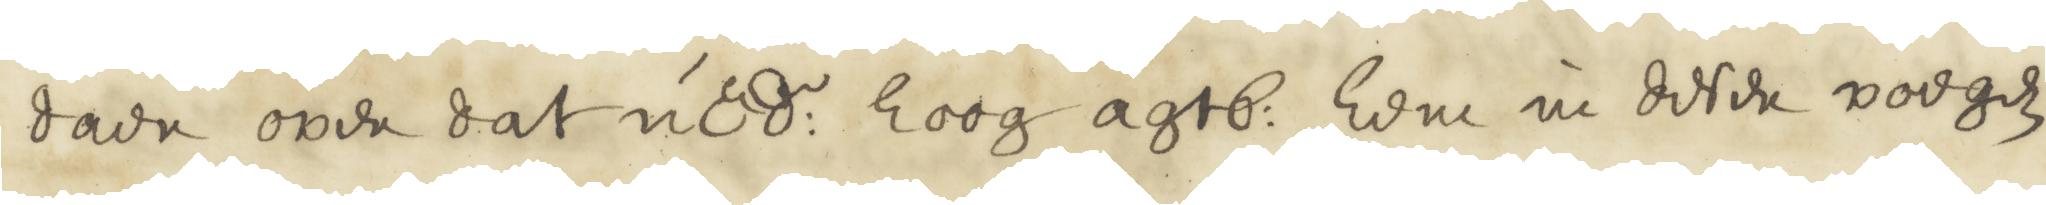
daer over dat uEd:' hoog agtb: hem in deser voegen
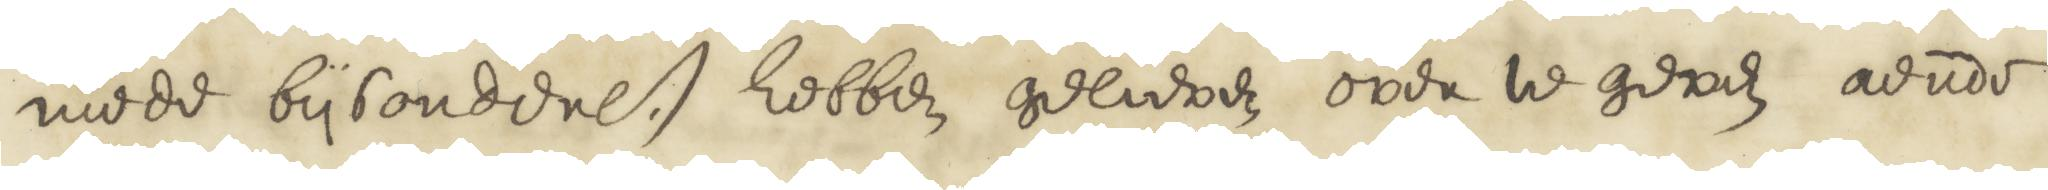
mede bijsonderlijk hebben gelieven over te geven aende
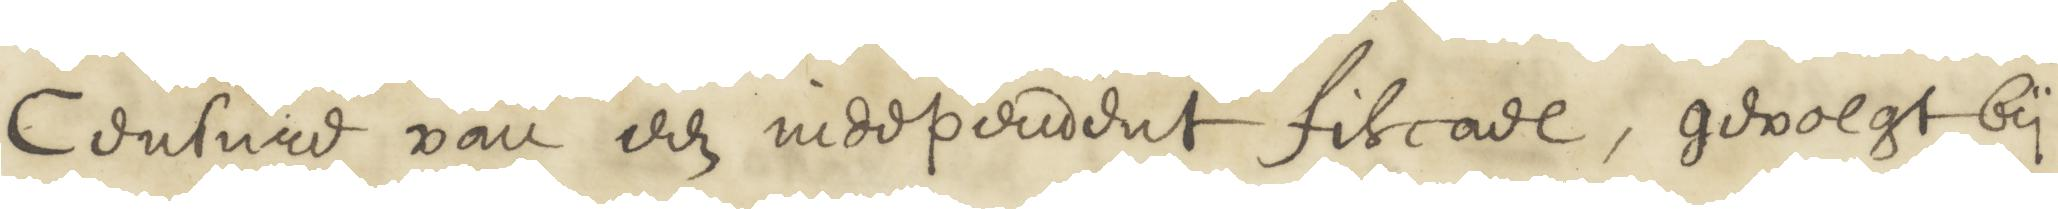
Censure van een independent fiscael, gevolgt bij
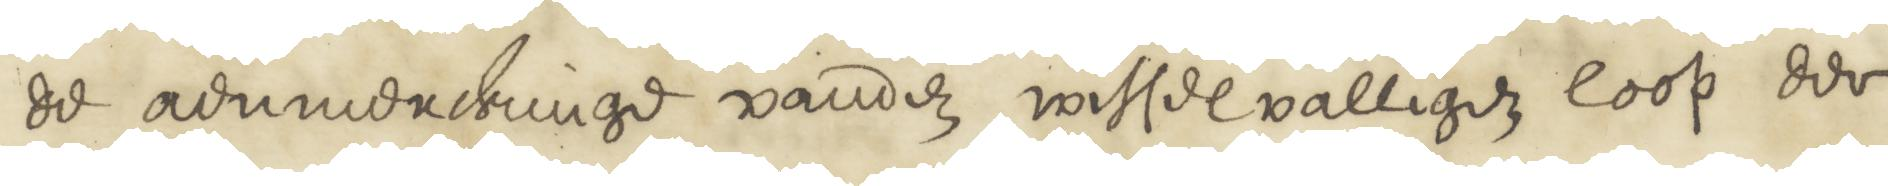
de aenmerckinge vanden wisselvalligen loop der
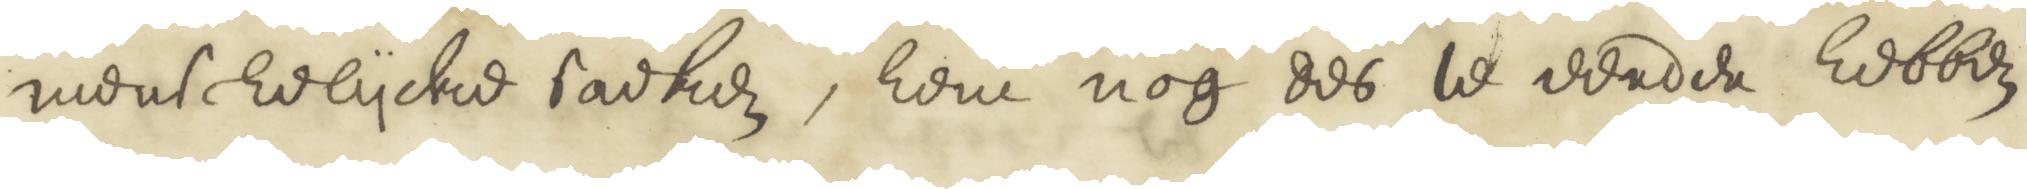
menschelijcke saeken, hem nog des te eerder hebben
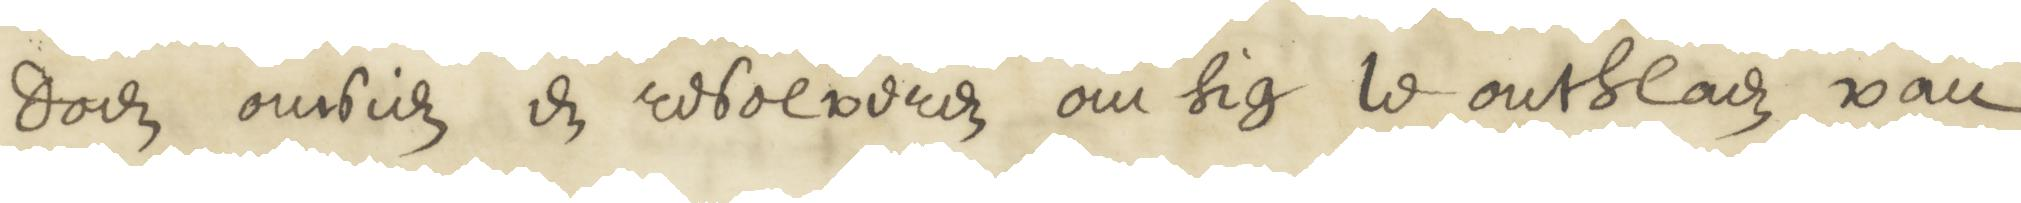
doen omsien en resolveren om sig te ontslaen van
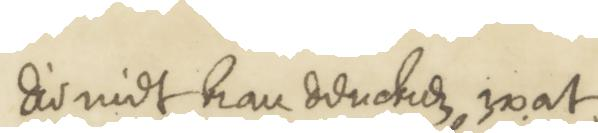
die niet kan dencken, wat
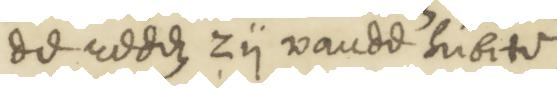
de reden zij vande subite
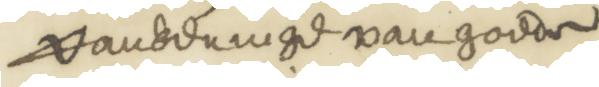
vanderinge van goede
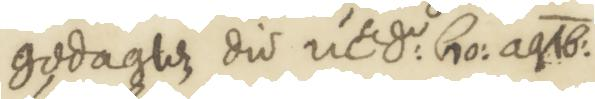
gedagten die uEd:e ho: agtb:
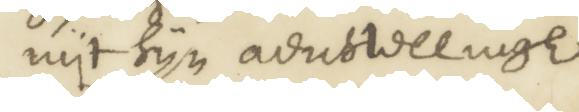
uijt sijn aenstellingh
